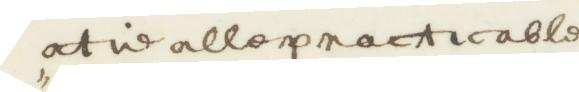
„atie alle practicable
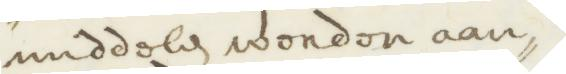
middelen worden aan„
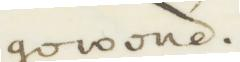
gewend.
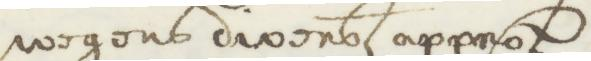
wegens diversz appro„ T
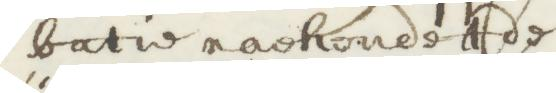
„batie raakende t de
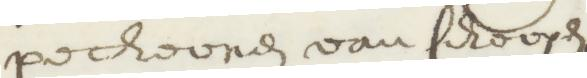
pecheeren van scheepen
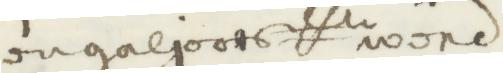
en galjoots en werd
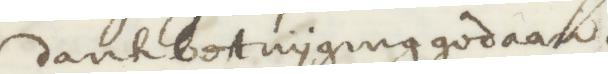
dank betuijging gedaan.
